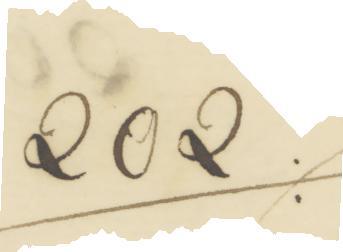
202
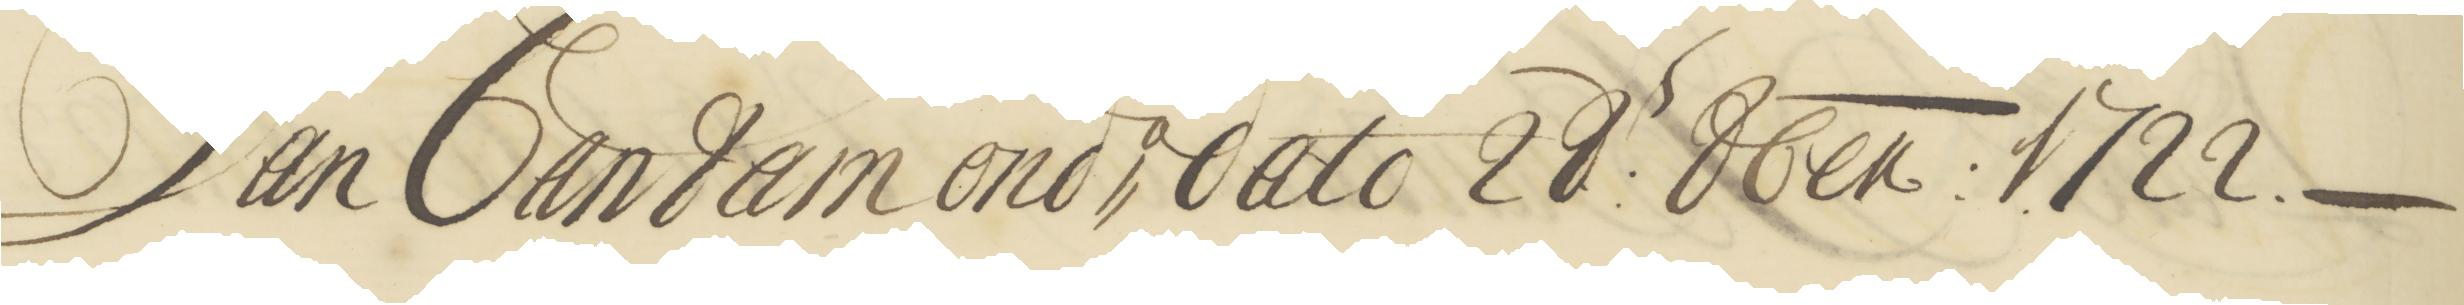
Van Bantam ond„r dato 28:' 8ber: 1722. —
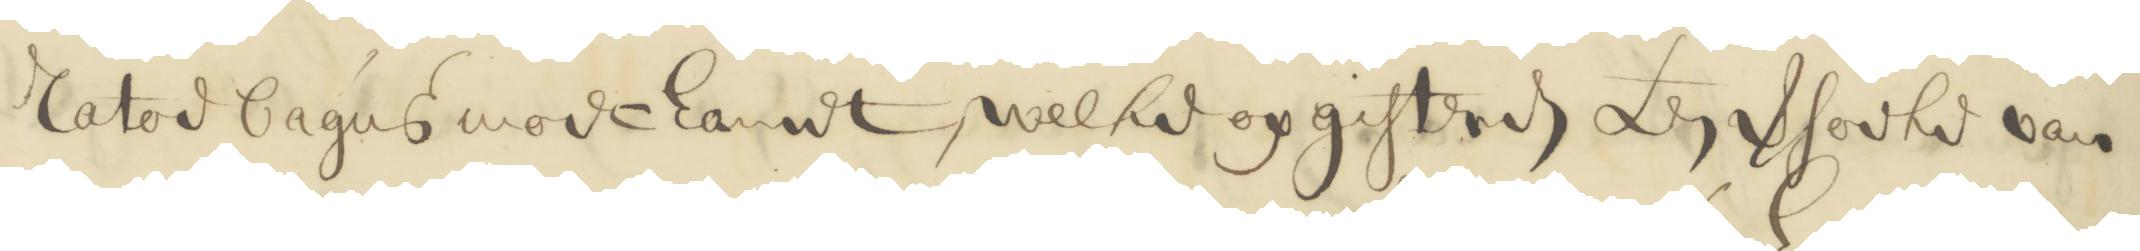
ratoe bagus moechamet, welke op gisteren ten versoeke van
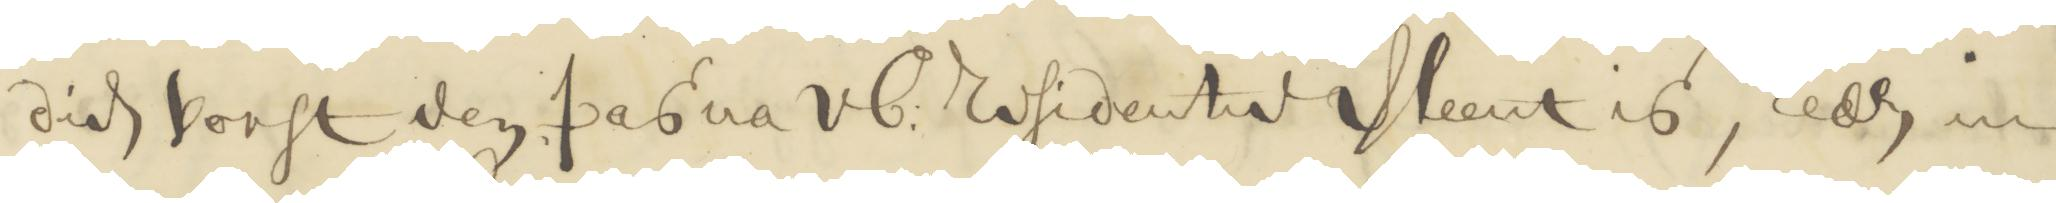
dien vorst een pas na VE: residentie verleent is, heden in
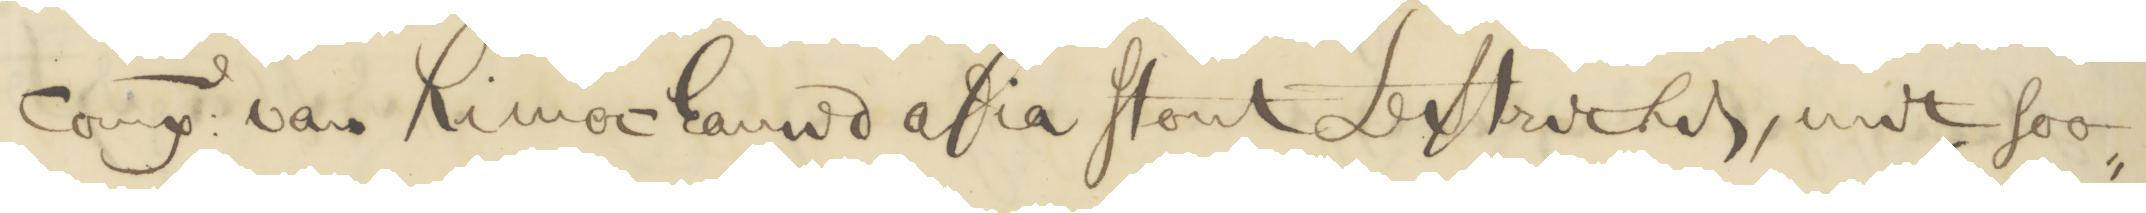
Comp:e van kimochamed afia stont te vertrecken, met soo„
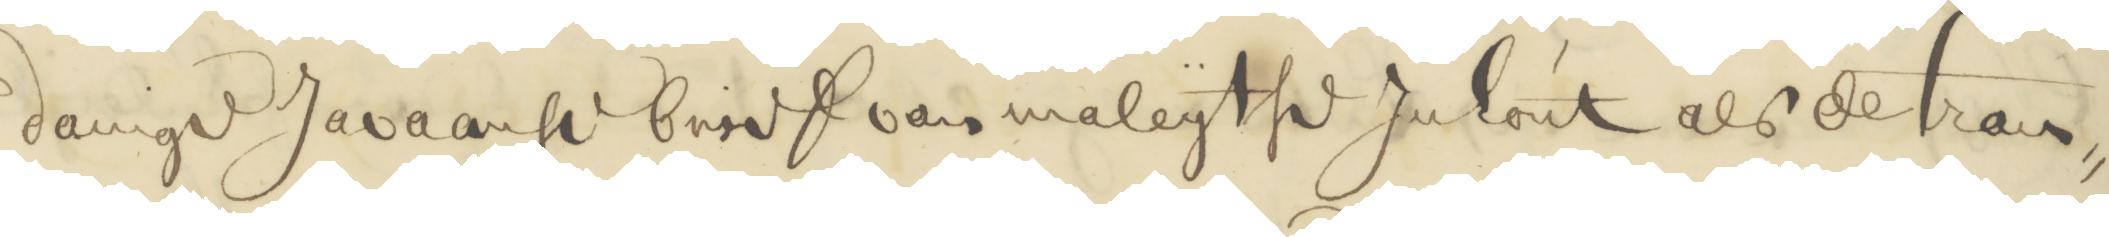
danige Javaanse brief van maleijtse Jnhout als de tran„
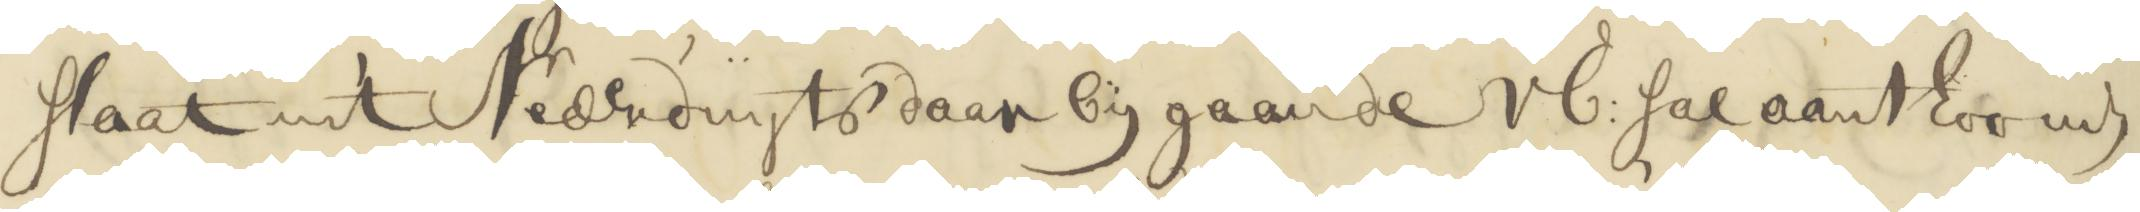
slaat in’t Nederduijts daar bij gaande VE: sal aanthoonen,
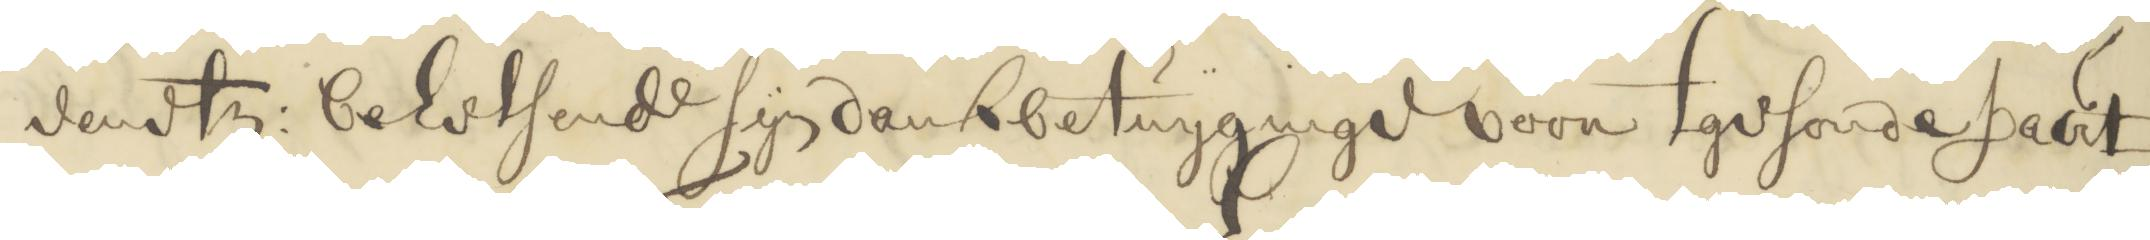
eenelijk behelsende sijn dankbetuijginge voor ’t gesonde paart
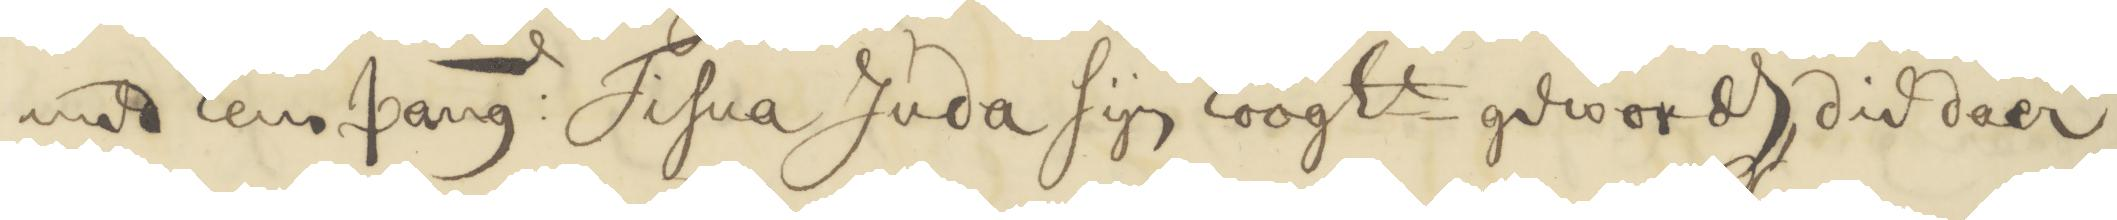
med hem pang:e Tisua Juda sijn hoogh=t geworden, die daer
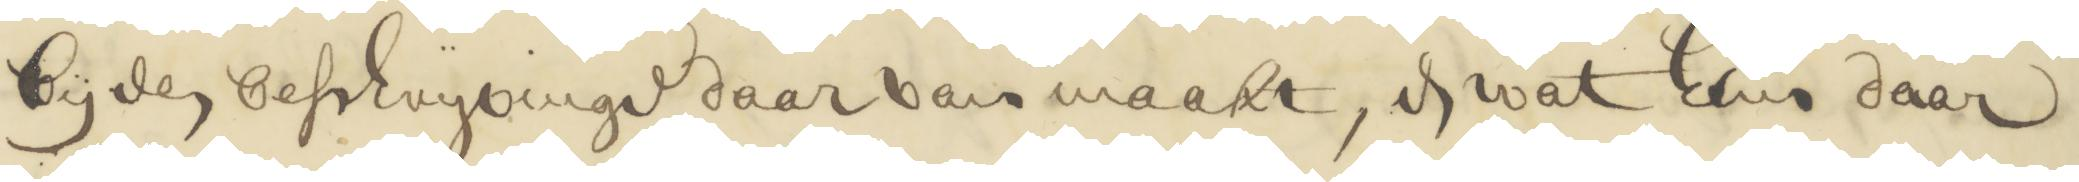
bij een beschrijvinge daar van maakt, en wat hem daar
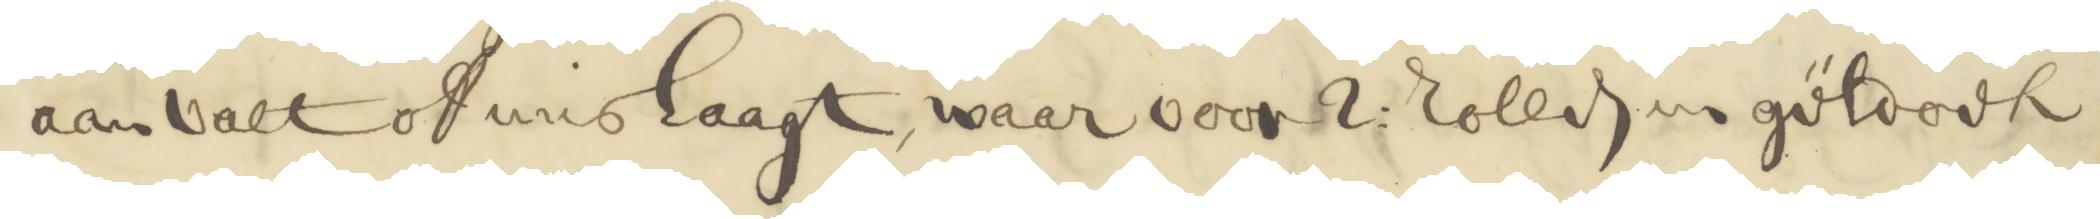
aan valt of mishaagt, waar voor 2: rollen in gëldoek
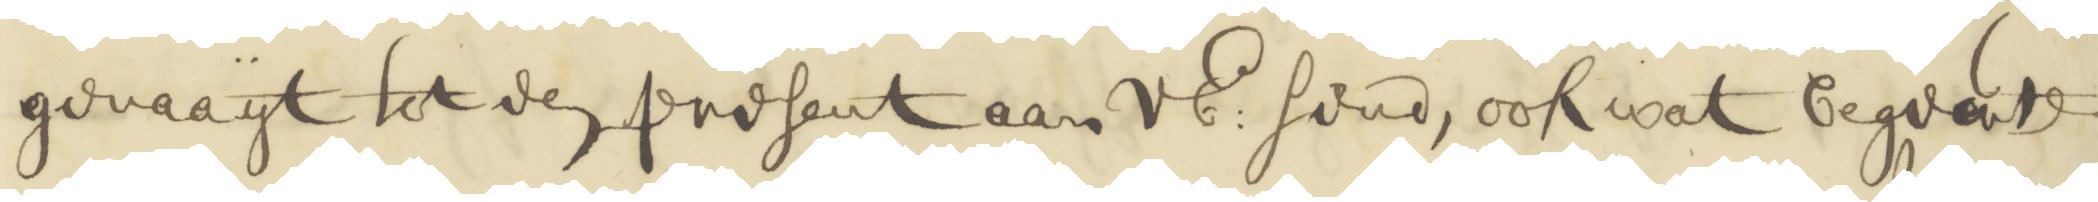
genaaijt tot een present aan VE: send, ook wat begeerte
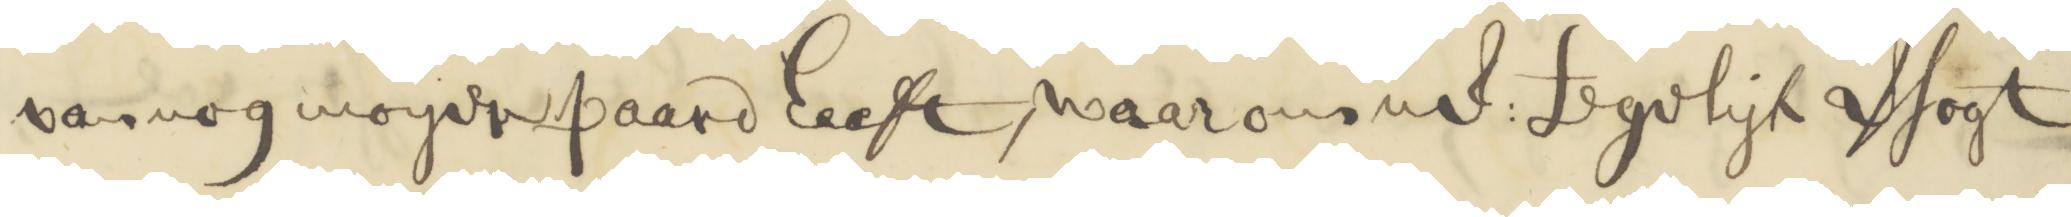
van nog moijer paard heeft, waarom uE: tegelijk versogt
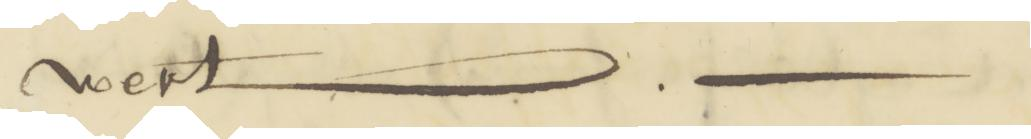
wert. —
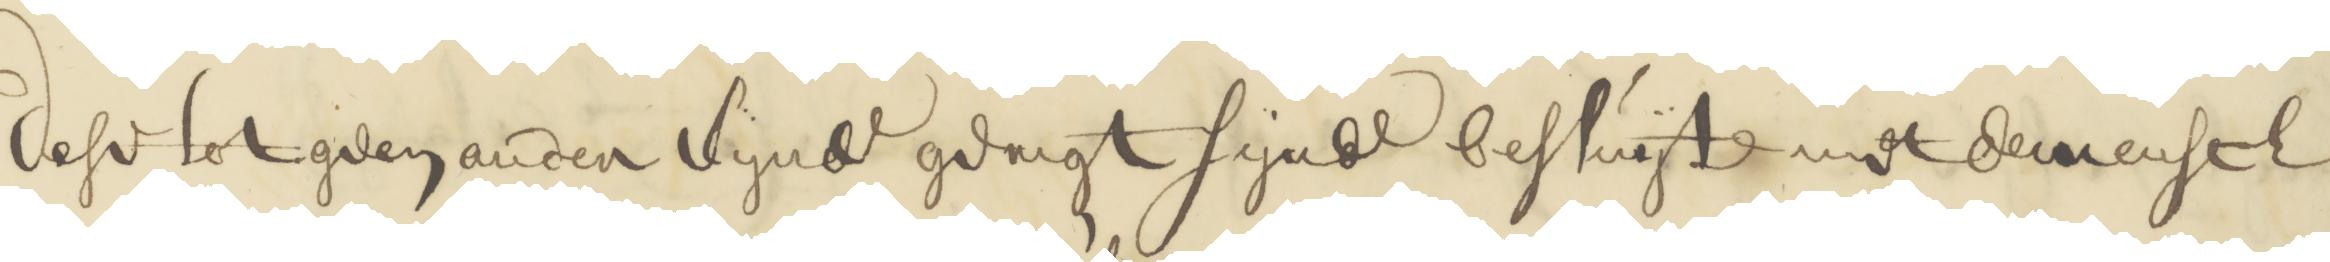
dese tot geen ander sijnde gerigt sijnde besluijte met demensch
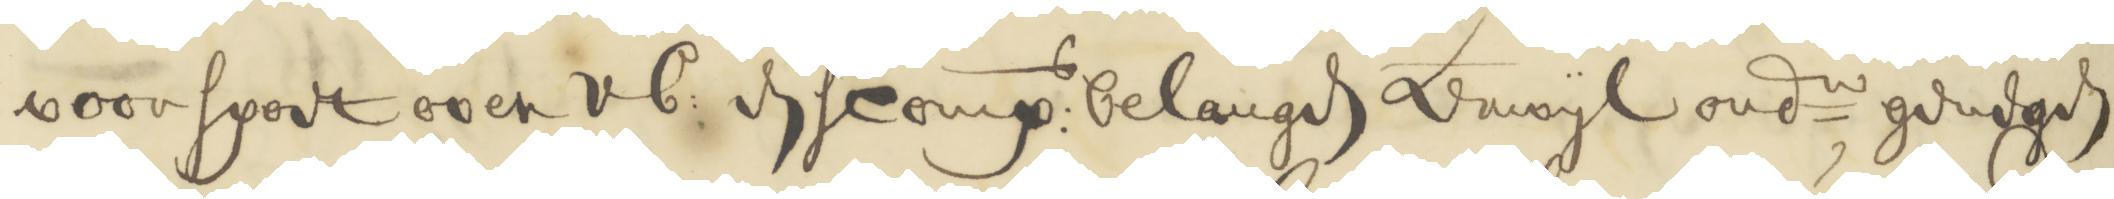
voor spoet over VE: en ’scomp:s belangen terwijl ond=r genegen
